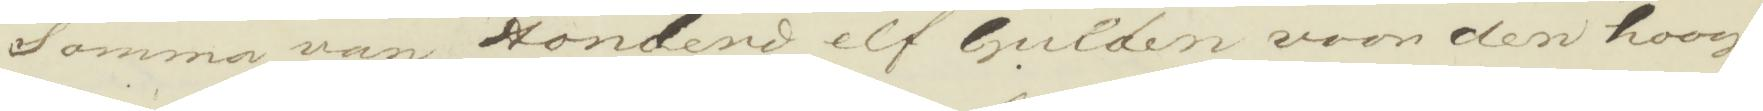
Somma van Honderd elf Gulden voor den hoog
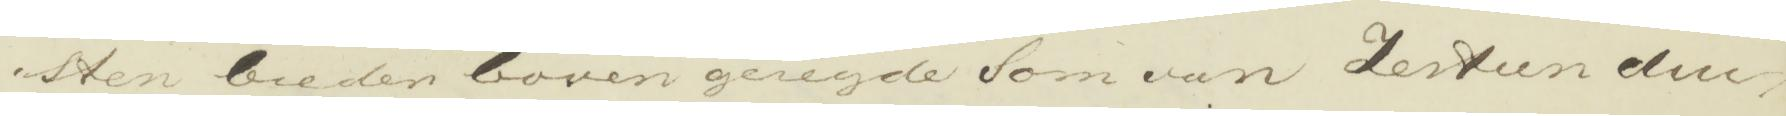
„sten bieder boven gezegde som van Zestien dui,
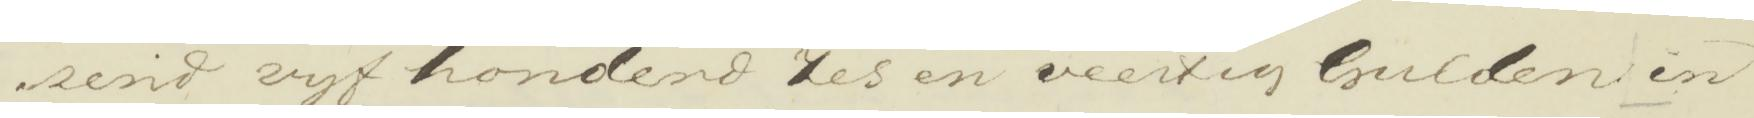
„zend vyf honderd zes en veertig Gulden in
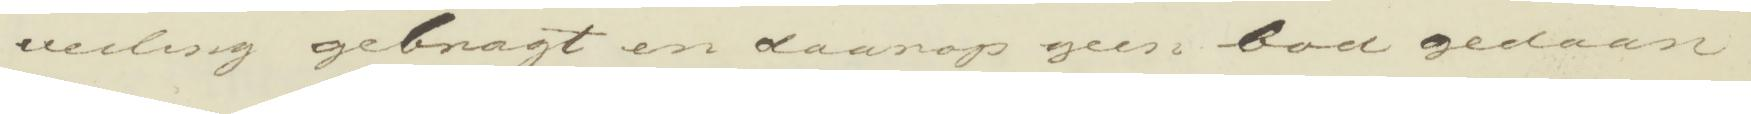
veiling gebragt en daarop geen bod gedaan
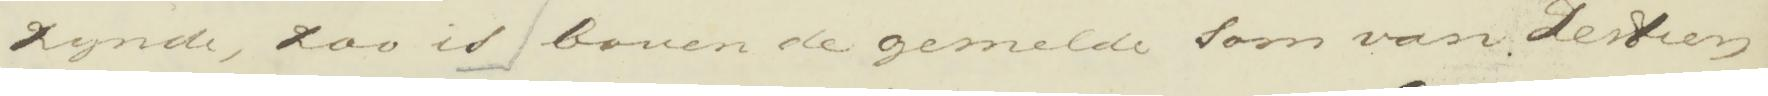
zijnde, zoo is] boven de gemelde som van Zestien
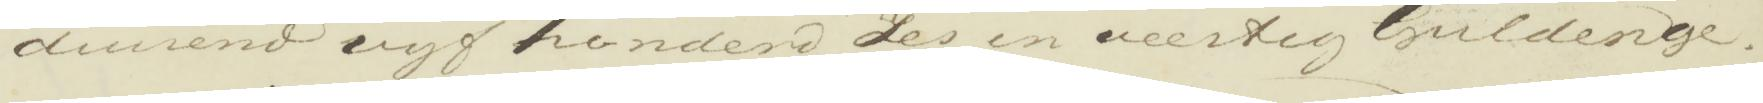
duizend vyf honderd Zes en veertig Gulden ge„
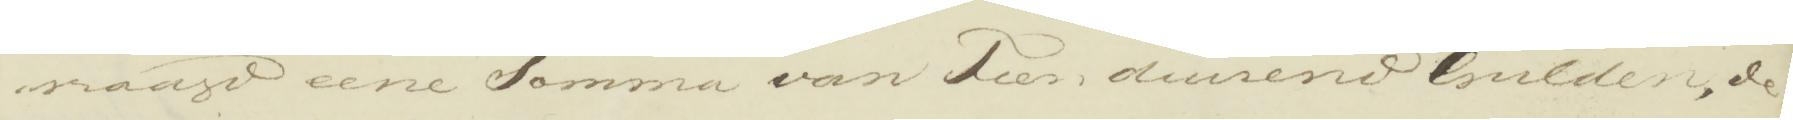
„vraagd eene somma van Tien duizend Gulden, de
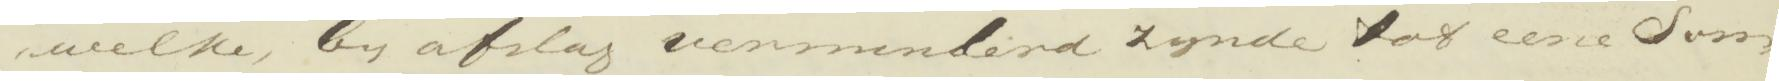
„welke, by afslag verminderd zijnde tot eene Som
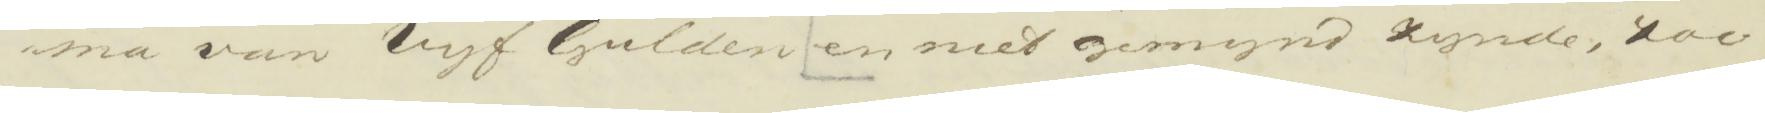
„ma van Vyf Gulden [en niet gemynd zynde, zoo
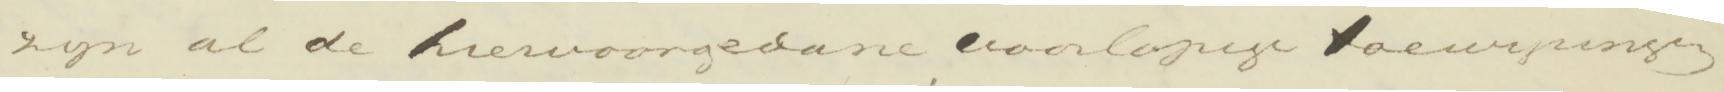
zyn al de hiervoorgedane voorlopige toewyzingen
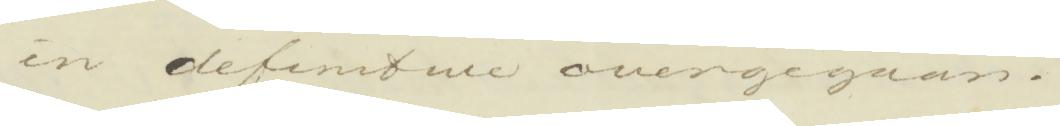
in definitive overgegaan.
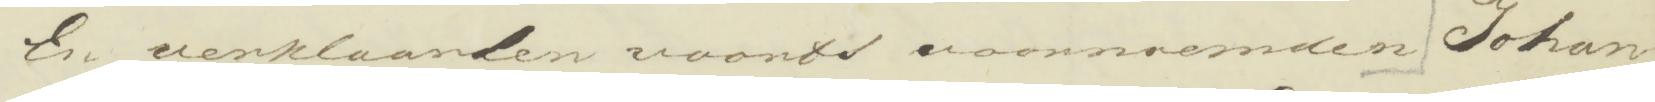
En verklaarden voorts voornoemden] Iohan
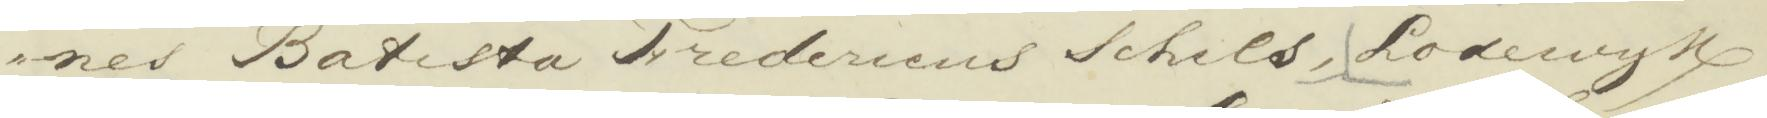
„nes Batista Fredericus Schils, [Lodewyk
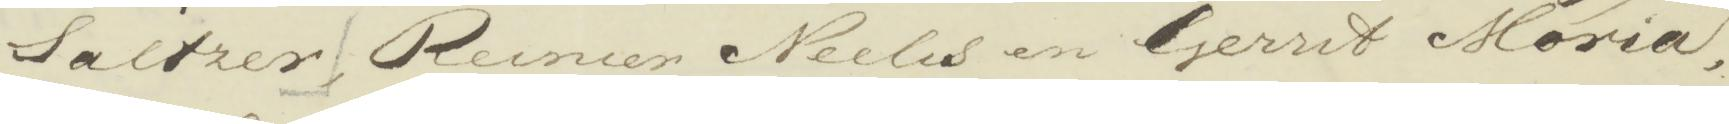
Saltzer], Reinier Neelis en Gerrit Moria,
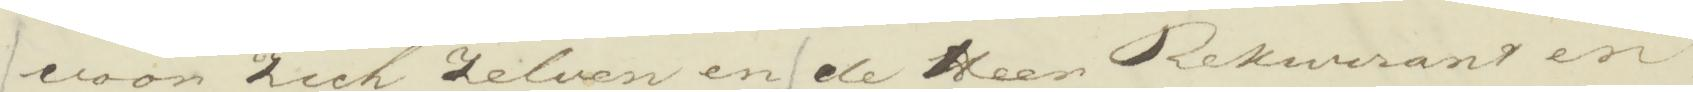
voor zich zelven en] de Heer Rekwirant en
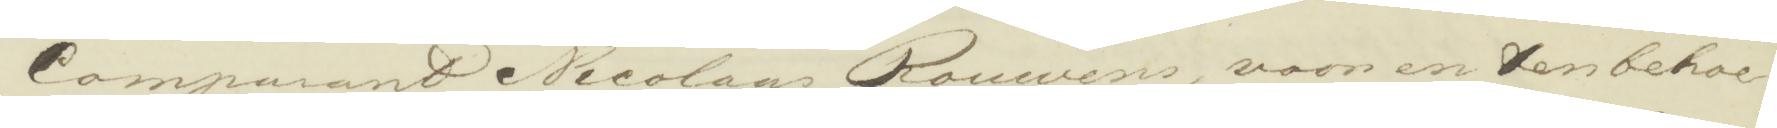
Comparant Nicolaas Rouwens, voor en ten behoe
